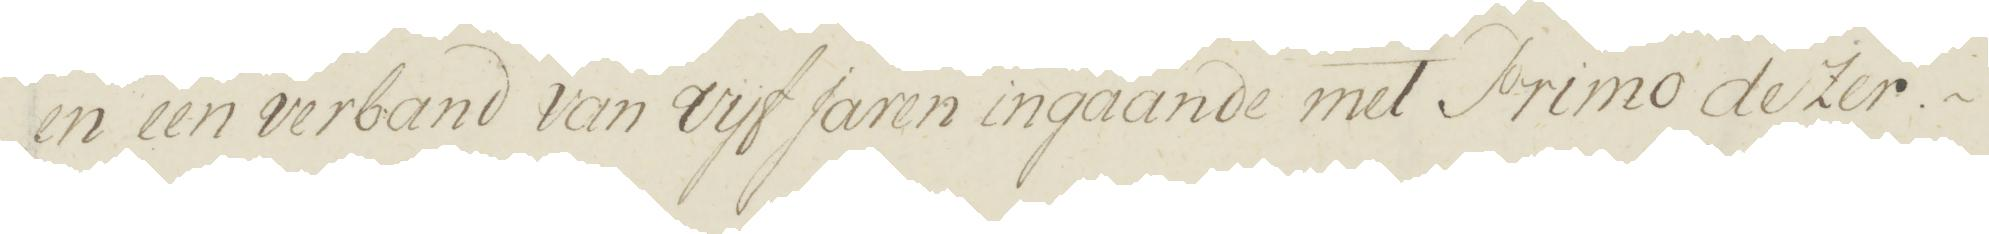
en een verband van vijf jaren ingaande met Primo dezer.-
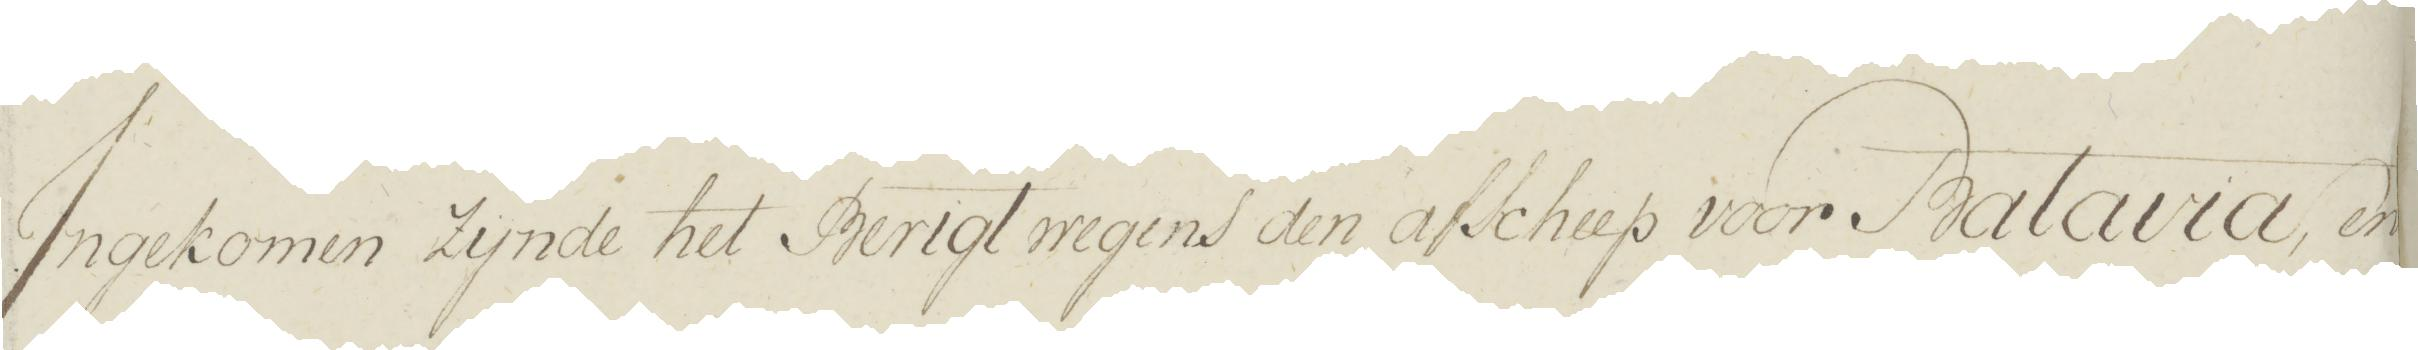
Jngekomen zijnde het Berigt wegens den afscheep voor Batavia, en
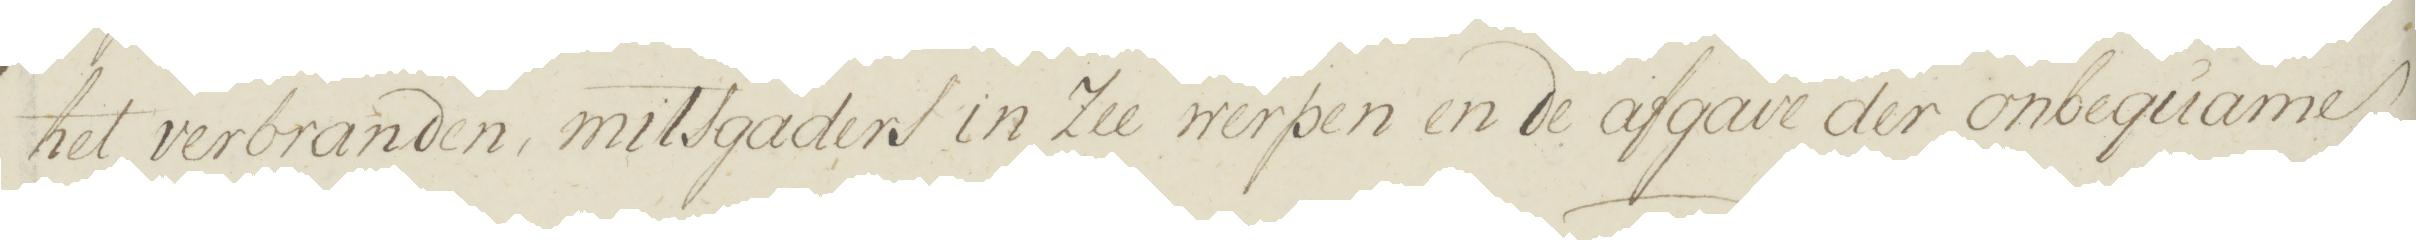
het verbranden, mitsgaders in zee werpen en de afgave der onbequame
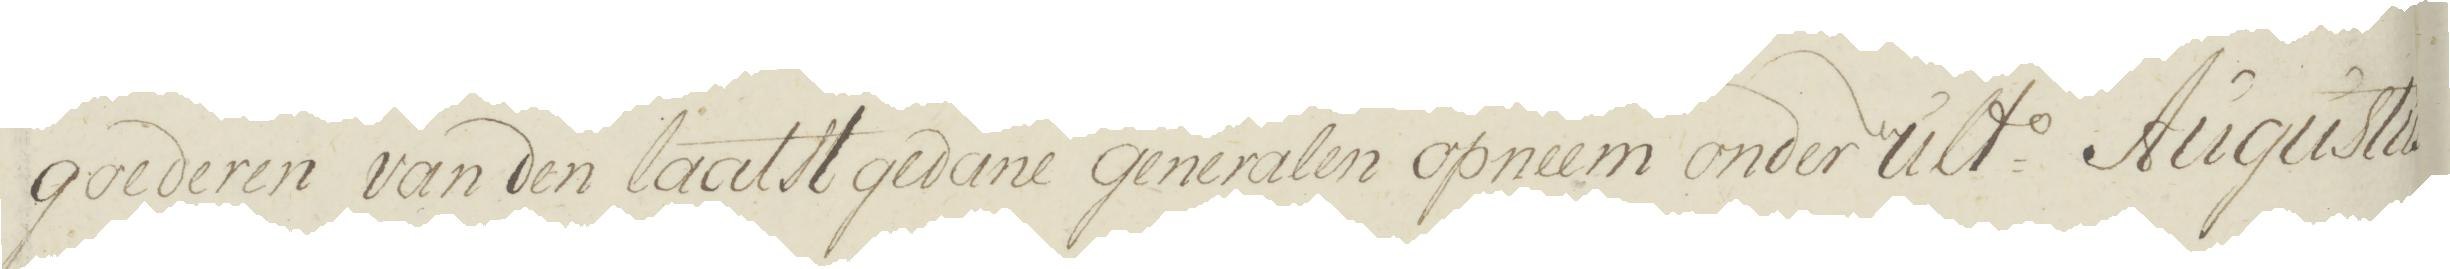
goederen van den laatst gedane generalen opneem onder ult=o Augustu
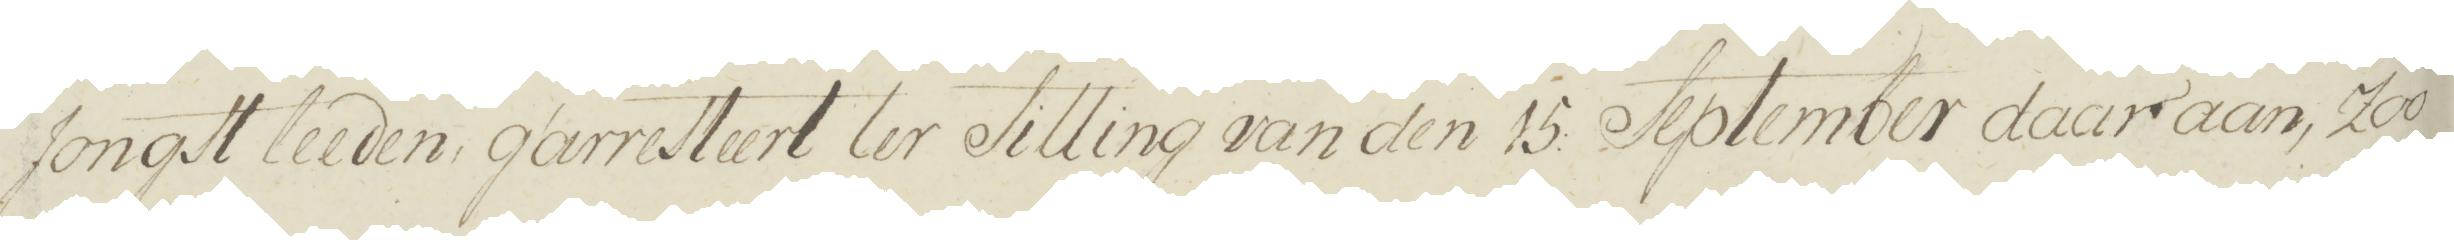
Jongst leeden, g'arresteert ter sitting van den 15: September daar aan, zoo
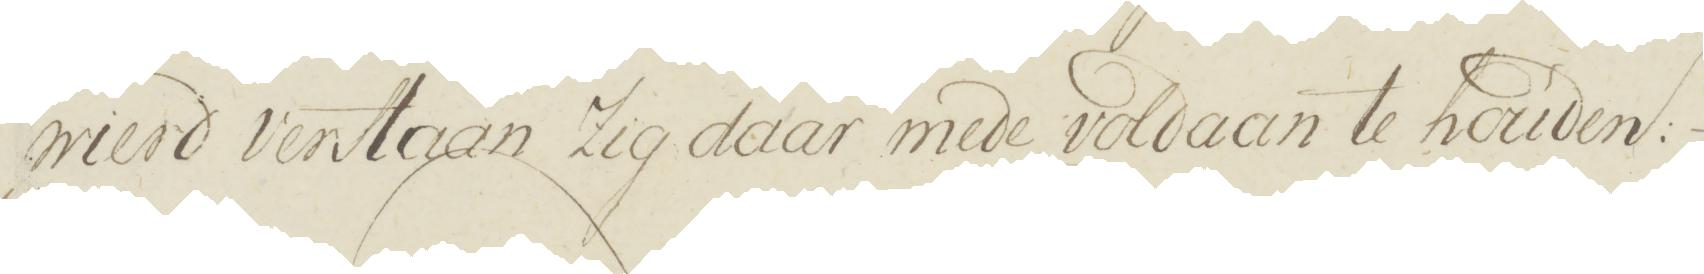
wierd verstaan zig daar mede voldaan te houden:
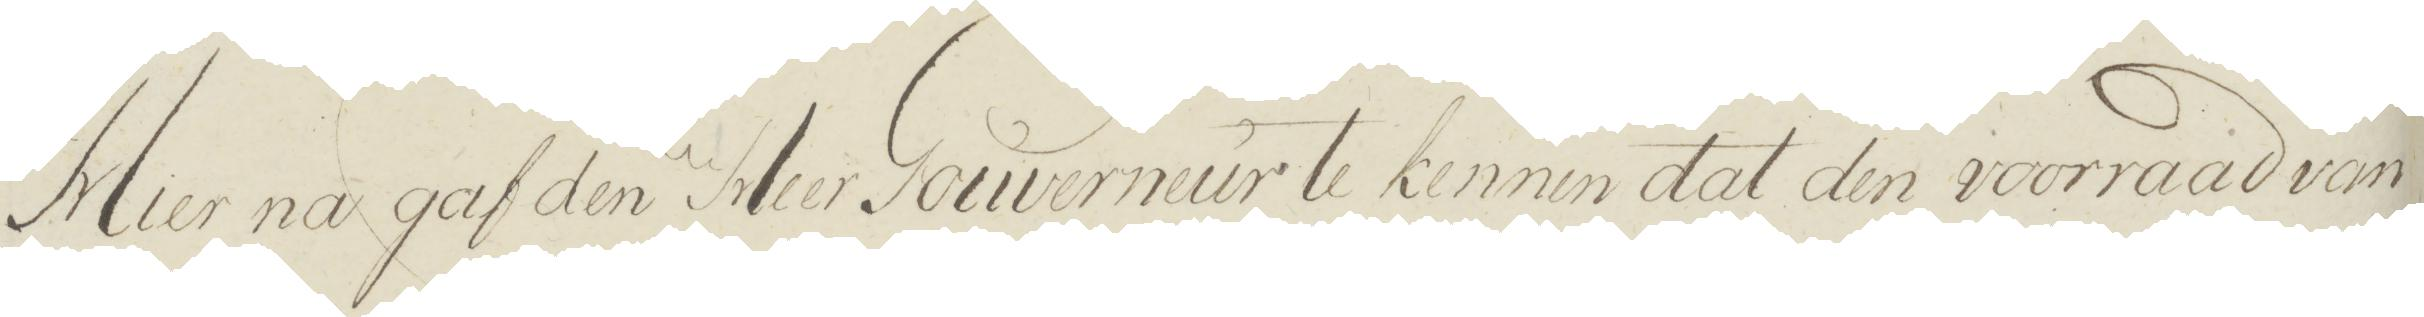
Hier na gaf den Heer Gouverneur te kennen dat den voorraad van
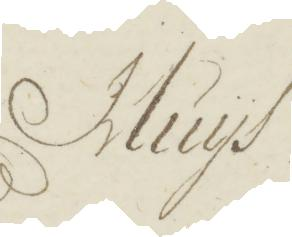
Huijs
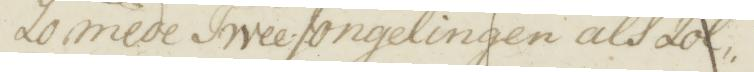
zo mede Twee Jongelingen als zol„
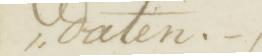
„daten.-
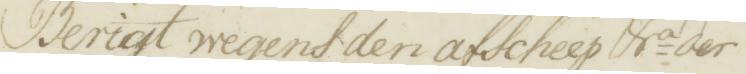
Berigt wegens den afscheep Et=a der
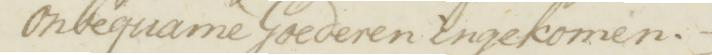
onbequame Goederen ingekomen.-
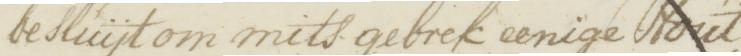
besluijt om mits gebrek eenige Hout
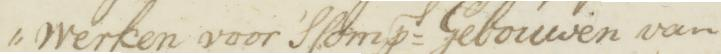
„werken voor ’s Comp:s Gebouwen van
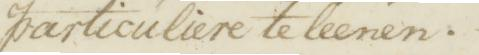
particuliere te leenen.
